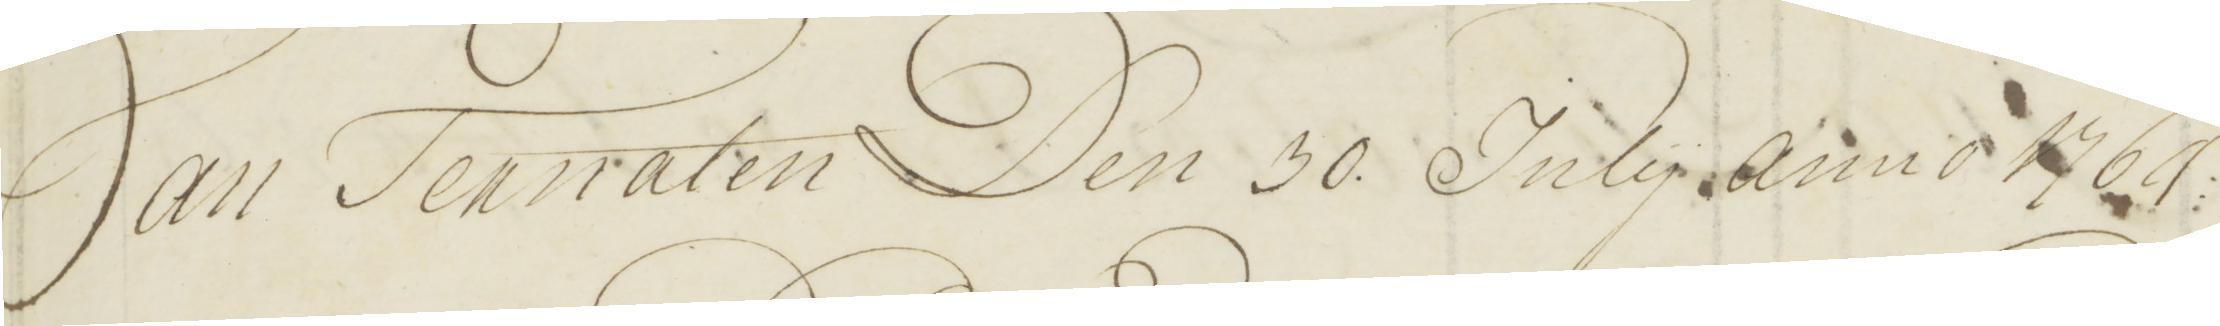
Van Ternaten Den 30: Iulij anno 1764:
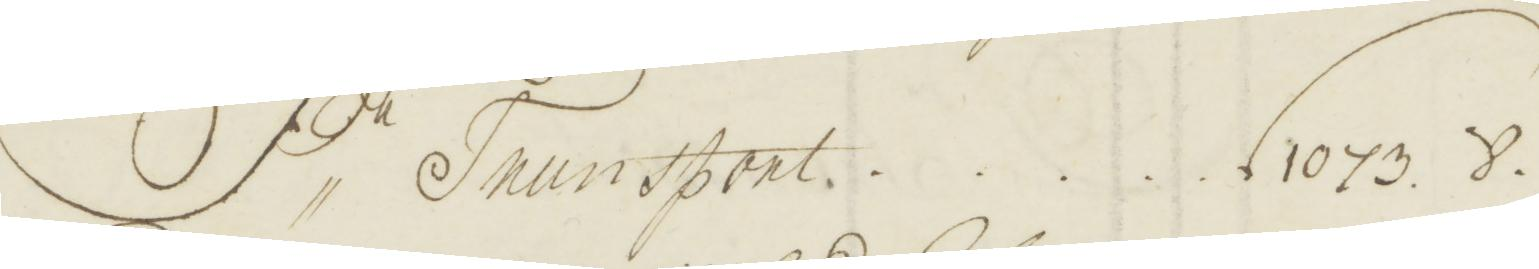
P„r Transport . . . . . . ƒ1073. 8.
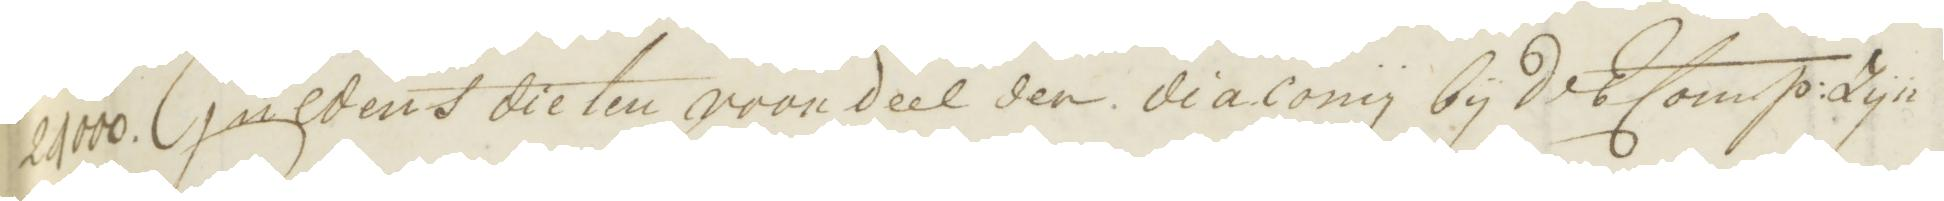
24000. Guldens die ten voordeel den diaconij bij de E Comp: zijn
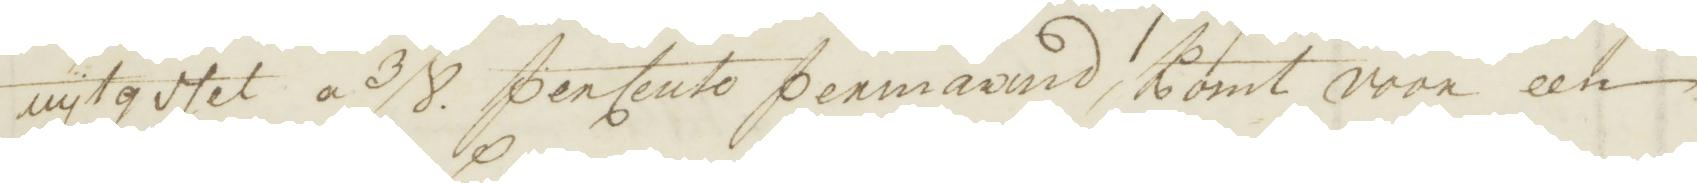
uijtgeset a 3/8. percento permaand, komt voor een
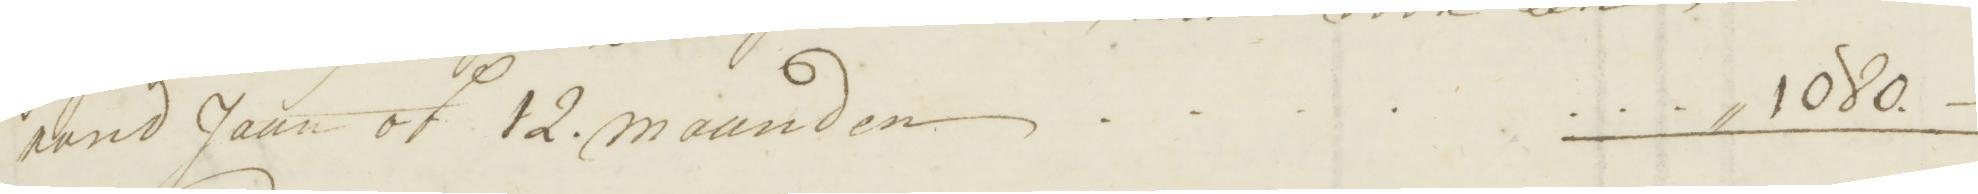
rond Jaar of 12. maanden . . . . . . . „ 1080.
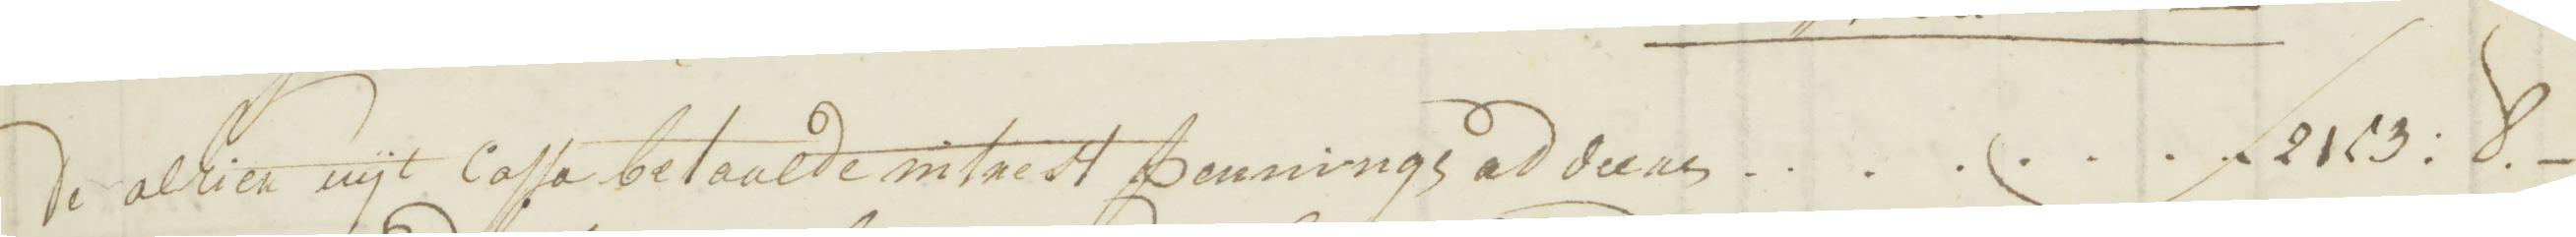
de alhier uijt Cassa betaalde intrest penningen addeeren . . . . . . . .ƒ2153: 8. —
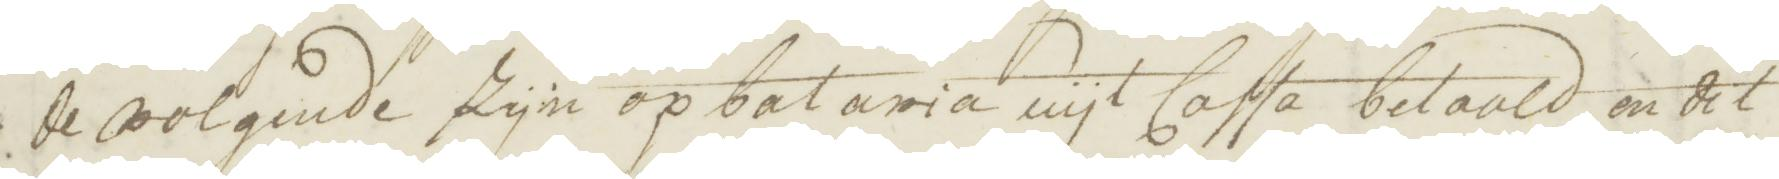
de volgende zijn op batavia uijt Cassa betaald, en dit
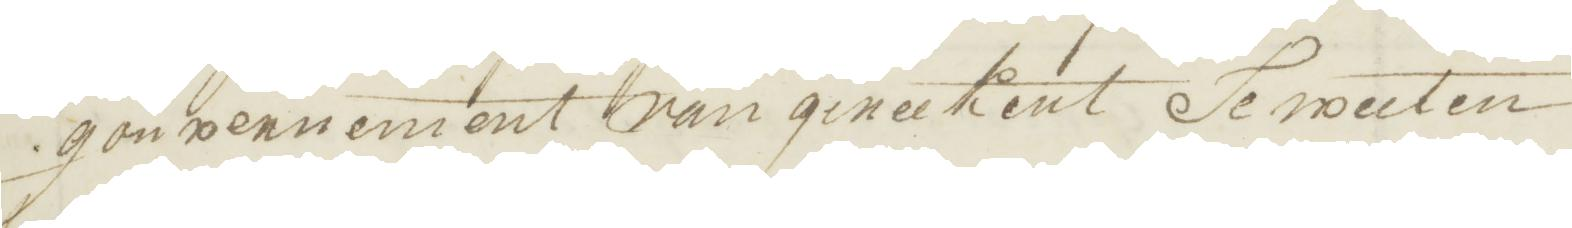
gouvernement van gereekent Te weeten
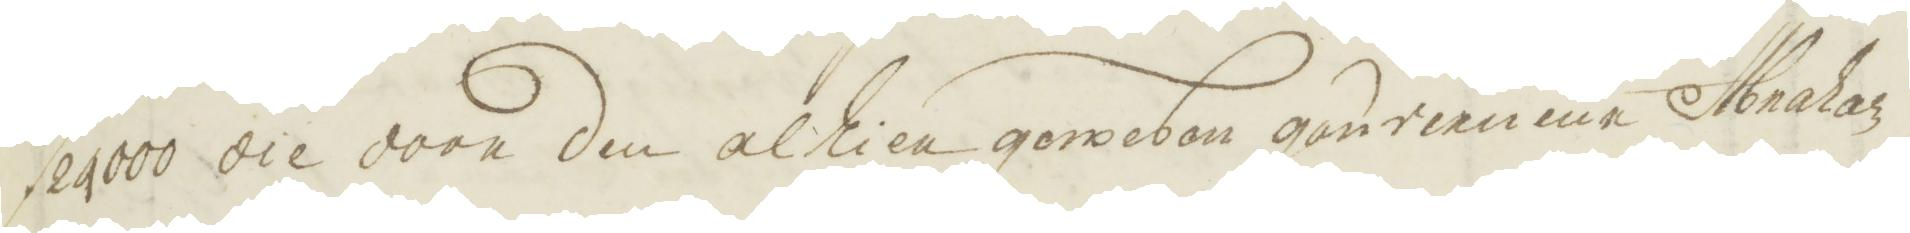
ƒ24000 die door den alhier gewesen gouverneur Abraham
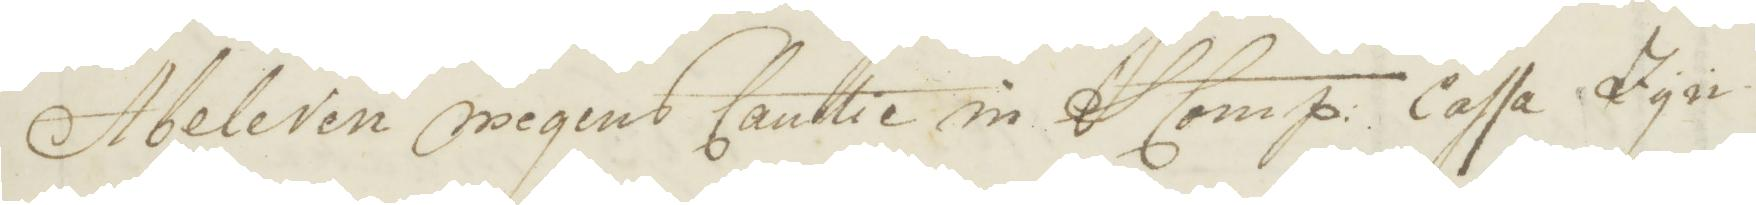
Abeleven wegens Cautie in 'S Comp: cassa zijn
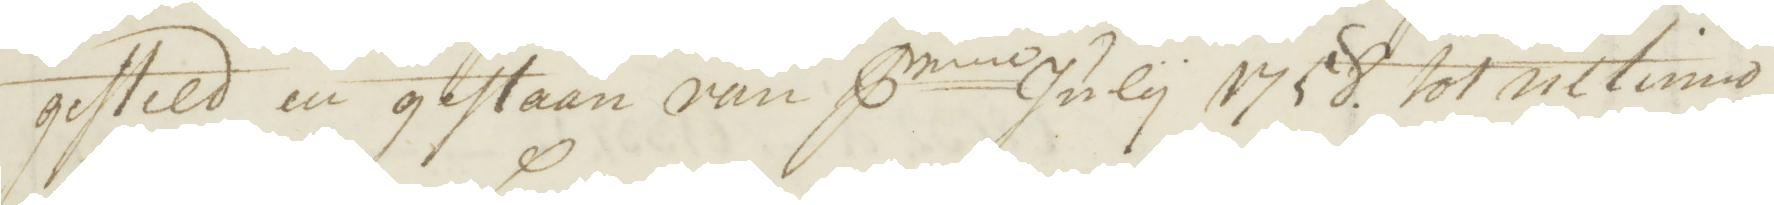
gesteld en gestaan van P=rmo Julij 1758. tot ultimo
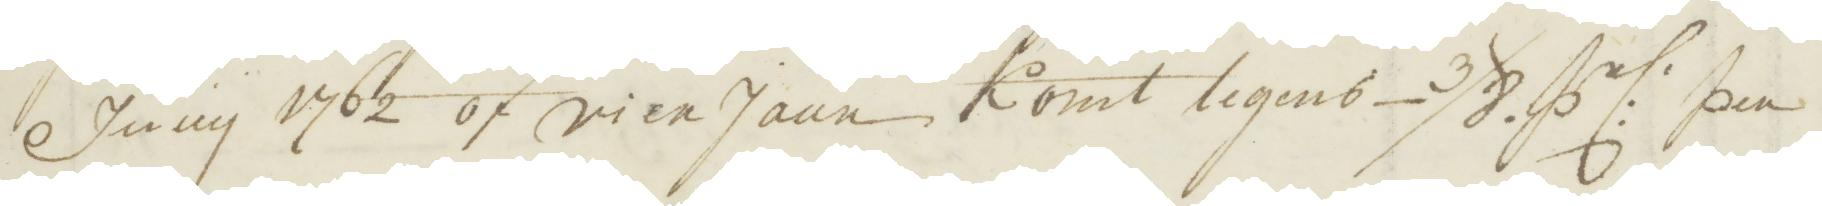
Junij 1762 of vier jaar komt tegens — 3/8. prC:' per
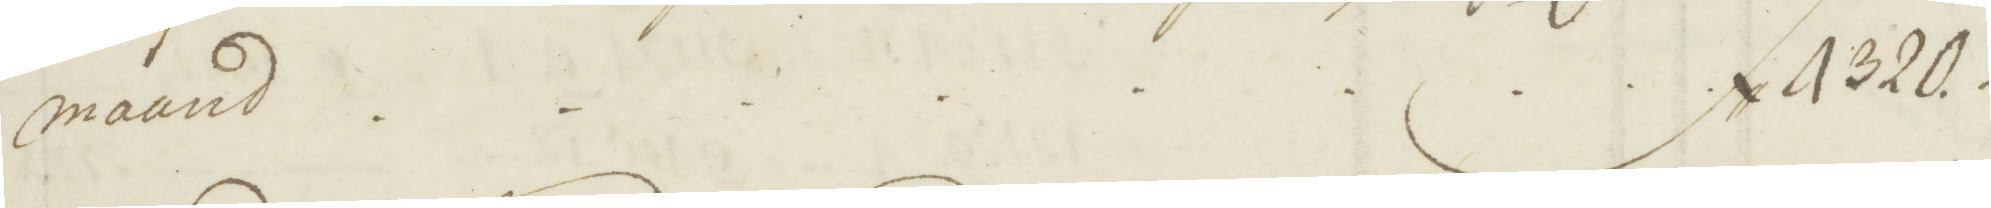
maand - - - - - - - - -ƒ4320.
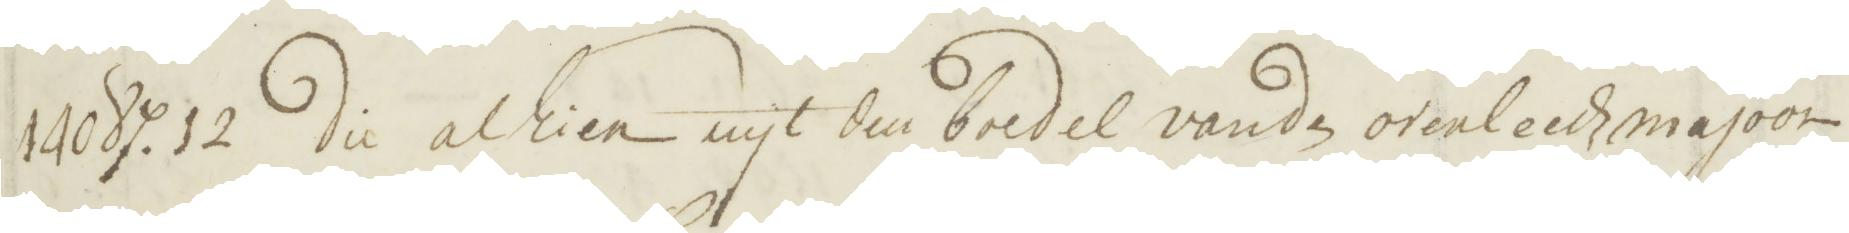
14087. 12 die alhier uijt den boedel van den overleeden majoor
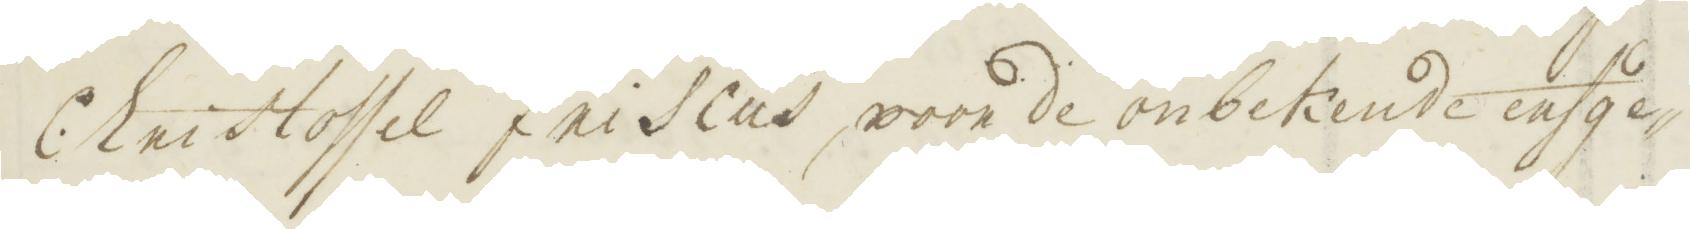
Christoffel friscus, voor de onbekende erfge„
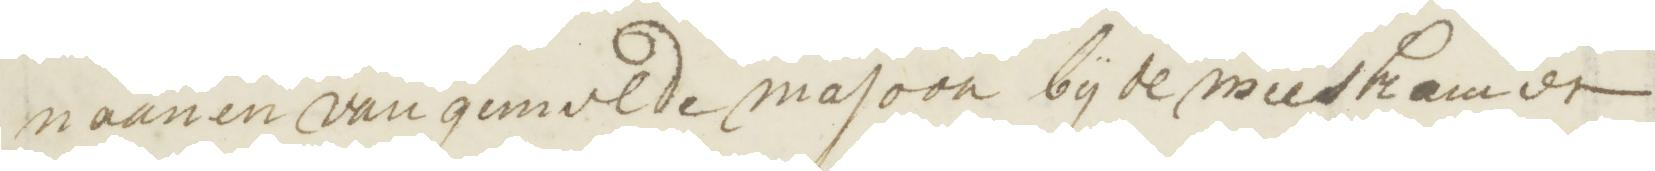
naamen van gemelde majoor bij de weeskamer
